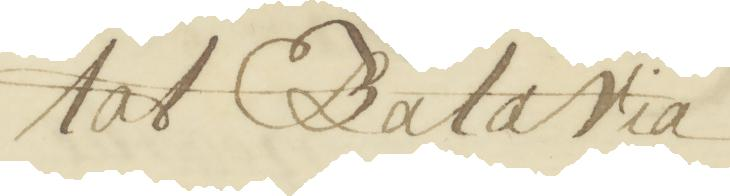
tot Batavia
